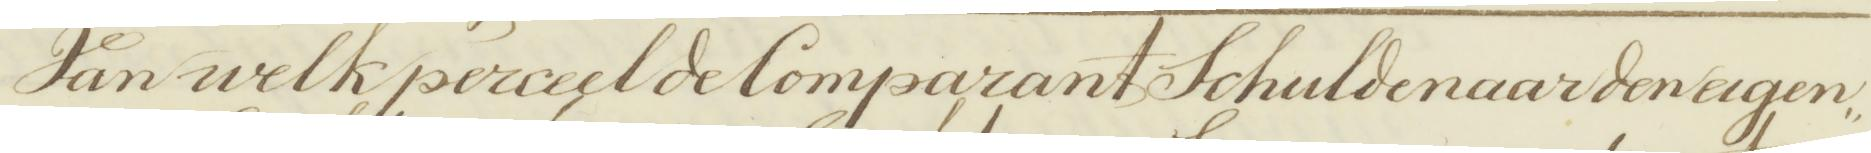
Van welk perceel de Comparant Schuldenaar den eigen„
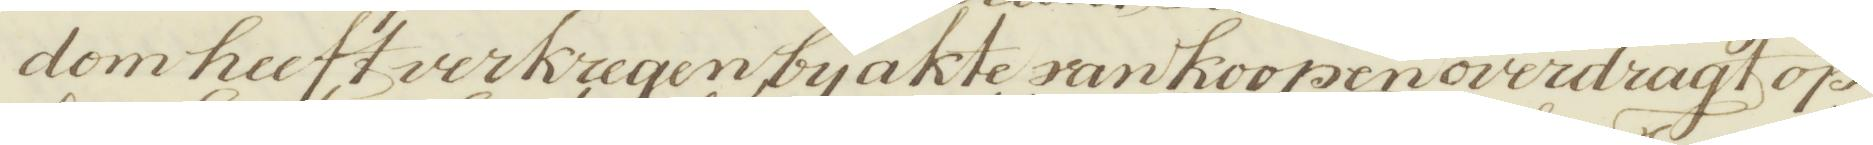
dom heeft verkregen, by akte van koop en overdragt op
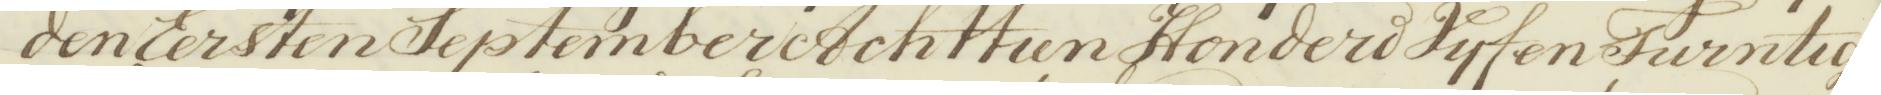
den Eersten September Achttien Honderd Vyf en Twintig
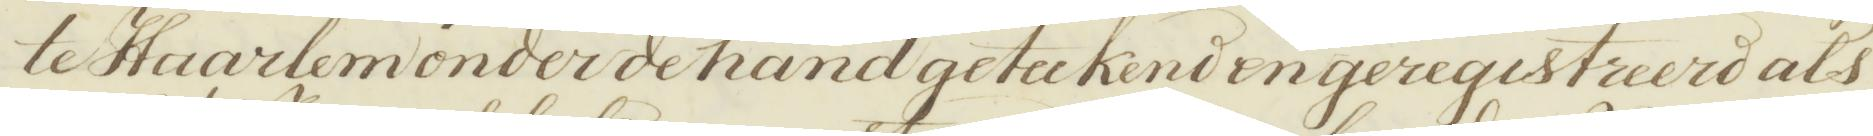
te Haarlem onder de handgeteekend en geregistreerd als
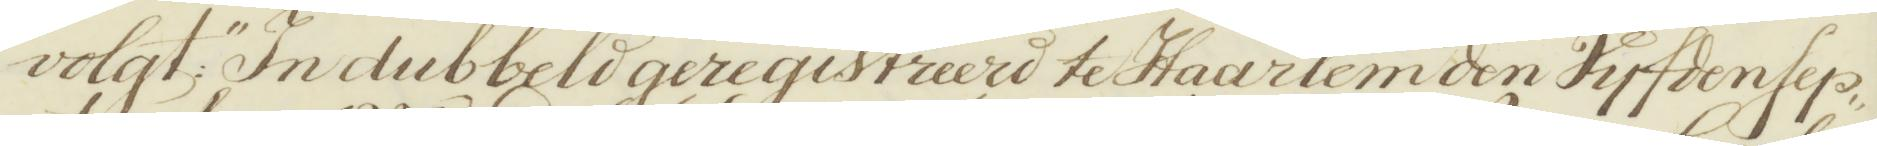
volgt:" In dubbeld geregistreerd te Haarlem den Vyfden Sep„
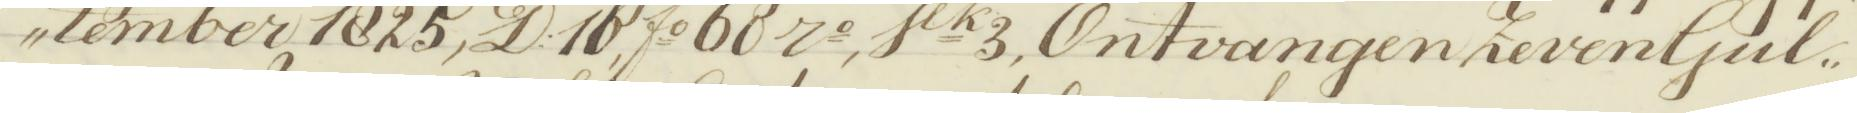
„tember 1825, D: 16 f=o 60 r=o V=k 3, Ontvangen Zeven Gul„
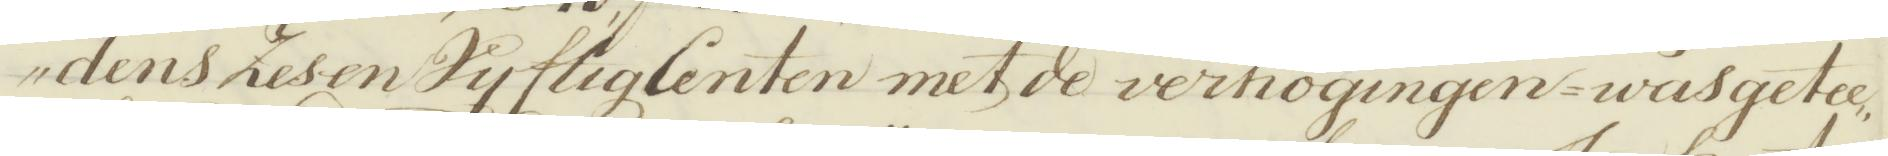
„dens Zes en Vyftig Centen met de verhogingen = was getee„
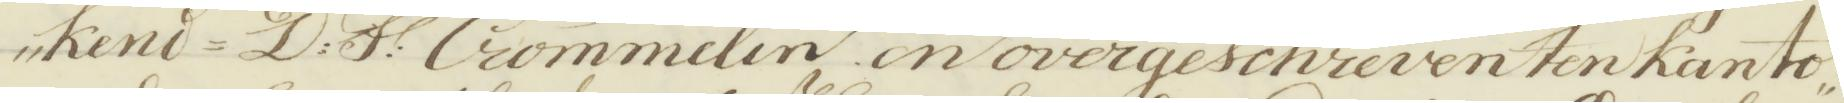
„kend = D: F: Crommelin" en overgeschreven ten kanto
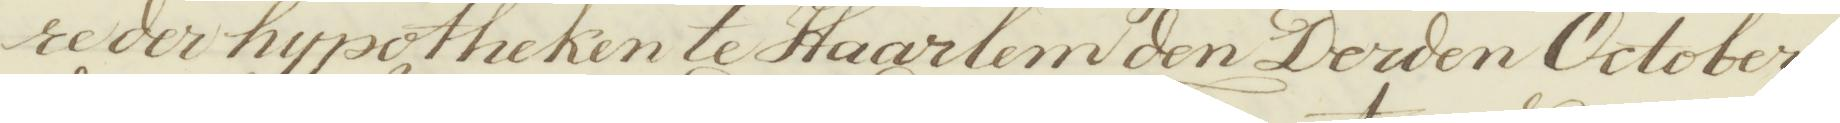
re der hypotheken te Haarlem den Derden October
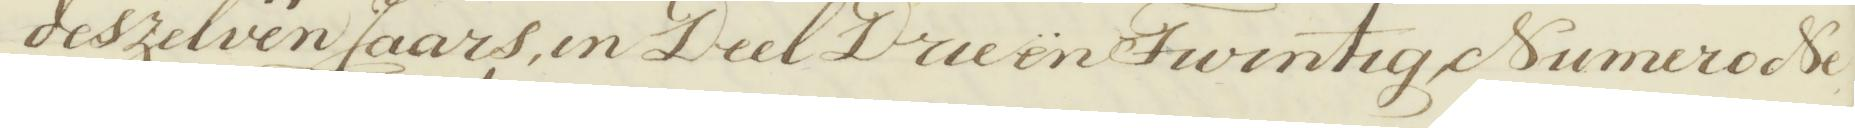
deszelven jaars, in Deel Drie en Twintig Numero Ne„
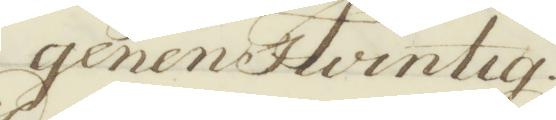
gen en Twintig.
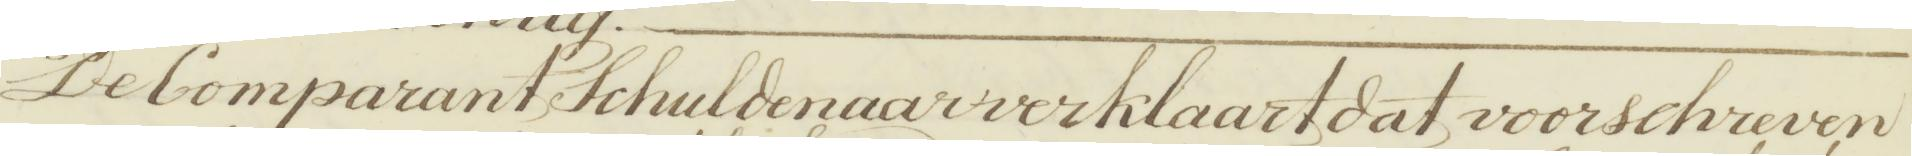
De Comparant Schuldenaar verklaart dat voorschreven
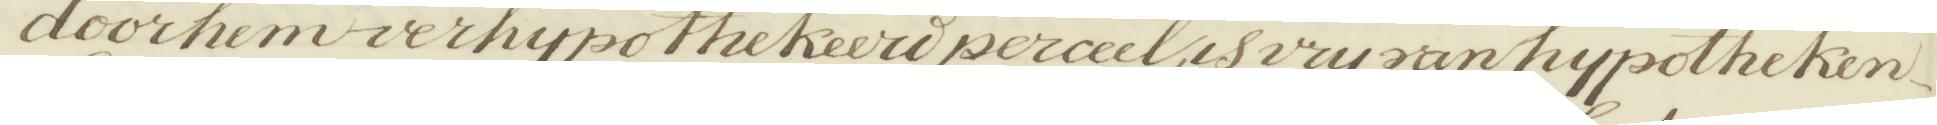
door hem verhypothekeerd perceel, is vry van hypotheken
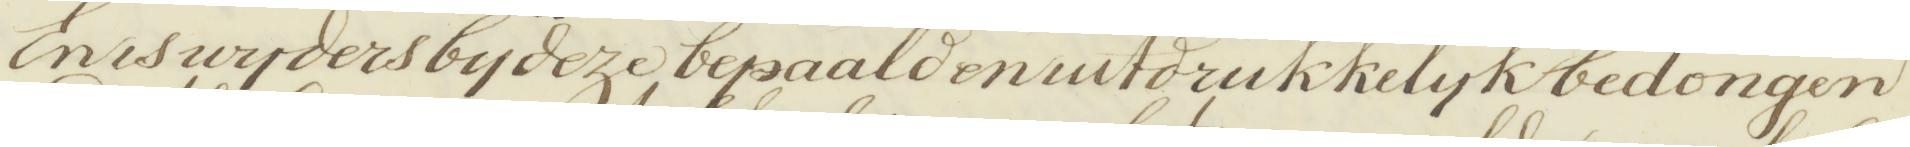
En is wyders by deze bepaald en uitdrukkelyk bedongen
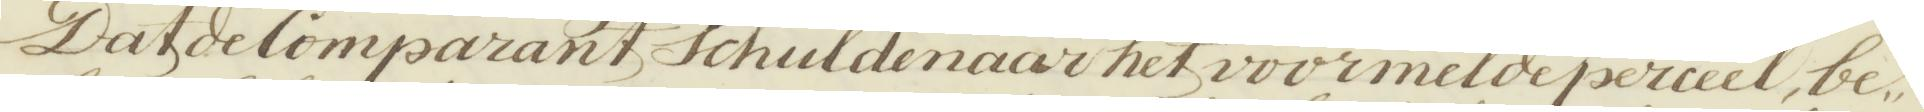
Dat de Comparant schuldenaar het voormelde perceel, be„
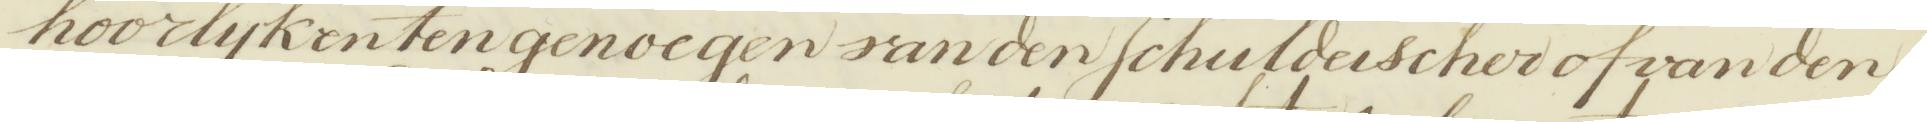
hoorlyken ten genoegen van den schuldeischer of van den
